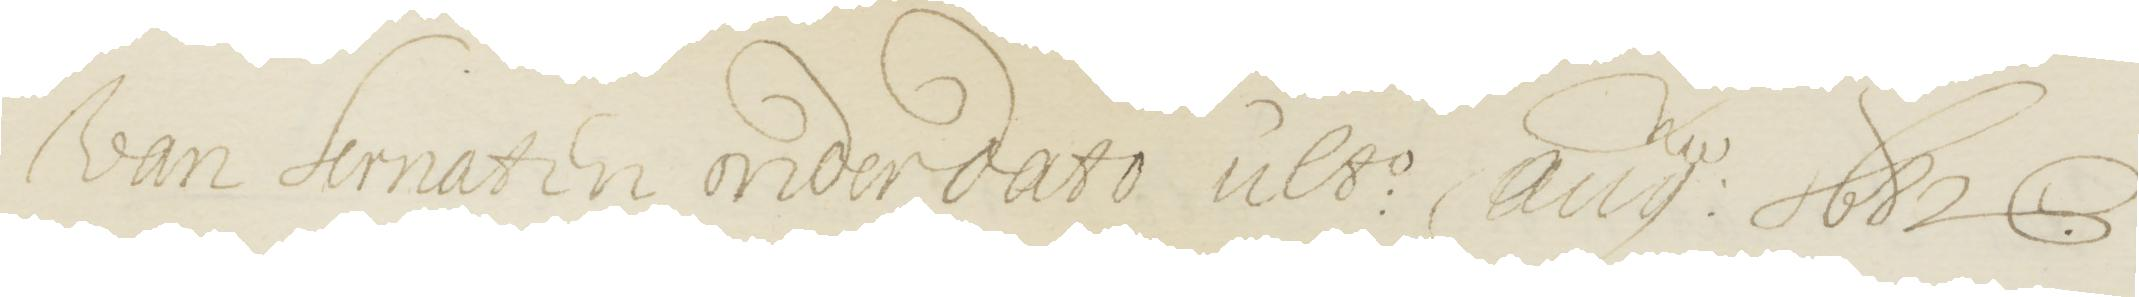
Van ternaten onder dato ult:o aug:o 1682.
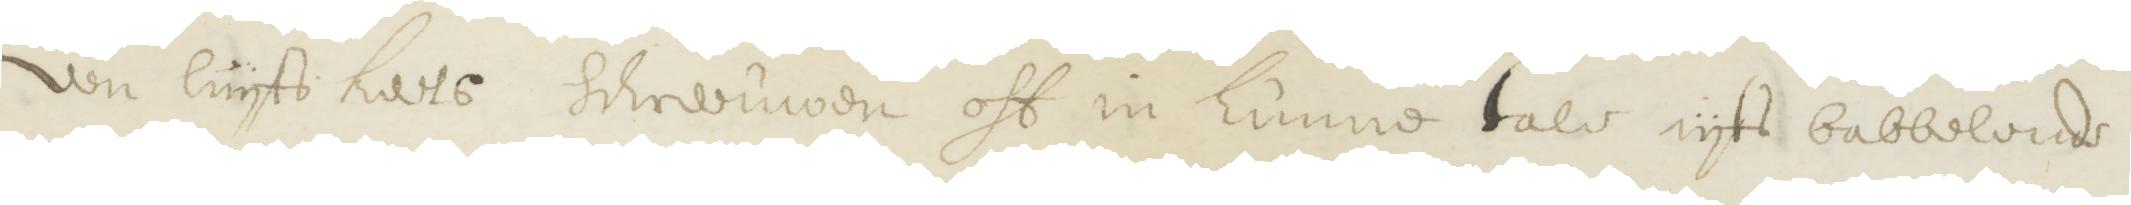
een luijts keets schreeuwen off in hunne tale rijts babbelende
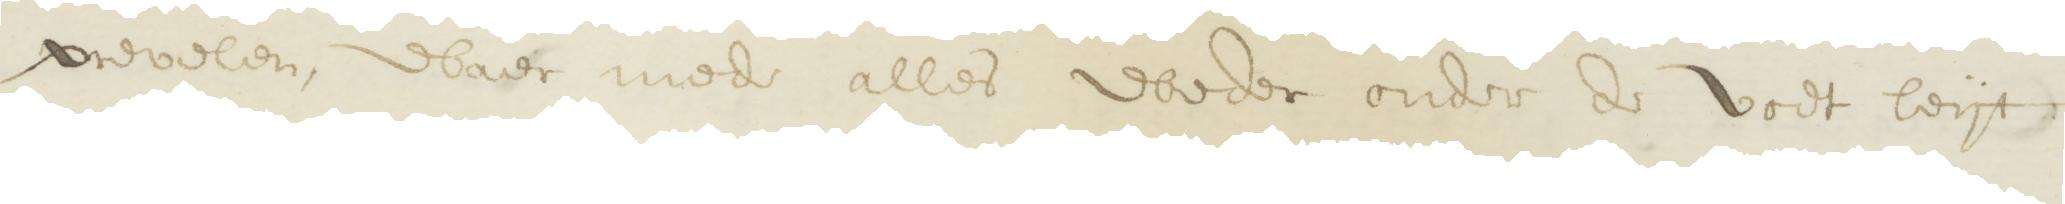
prevelen, waer mede alles weder onder de voet leijt
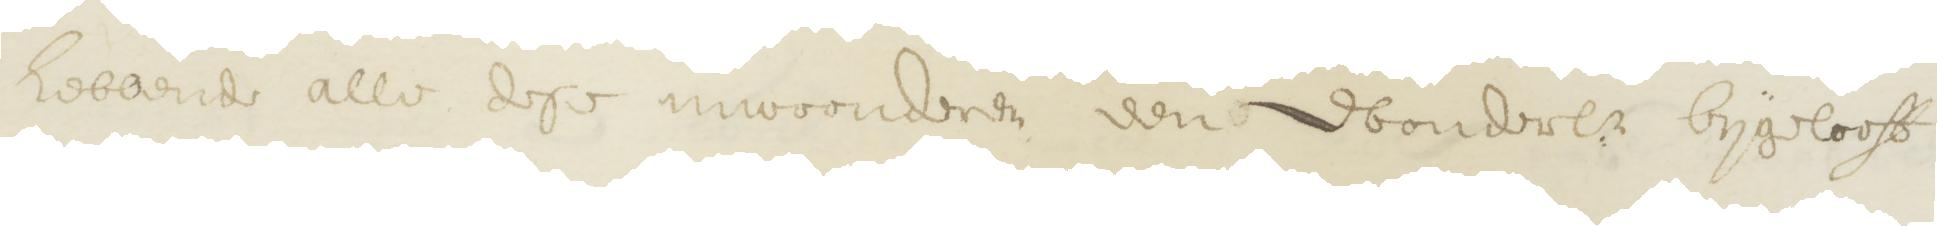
hebbende alle dese inwoonderen een wonderlijk bijgelooff
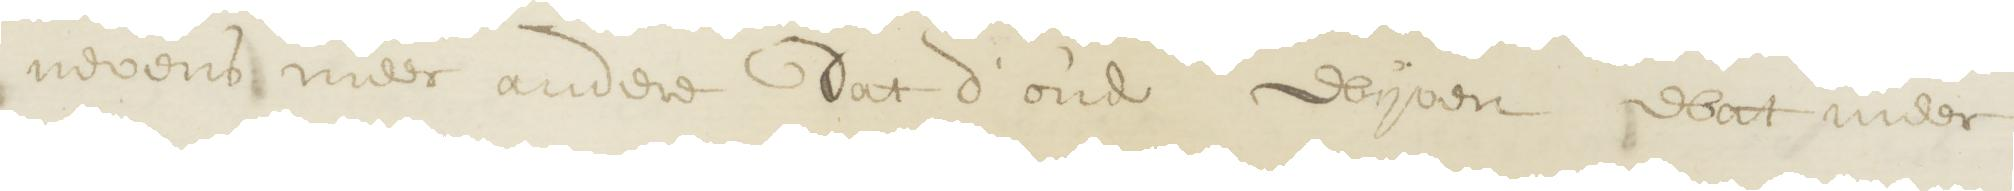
nevens meer andere dat d’ oude wijven wat meer
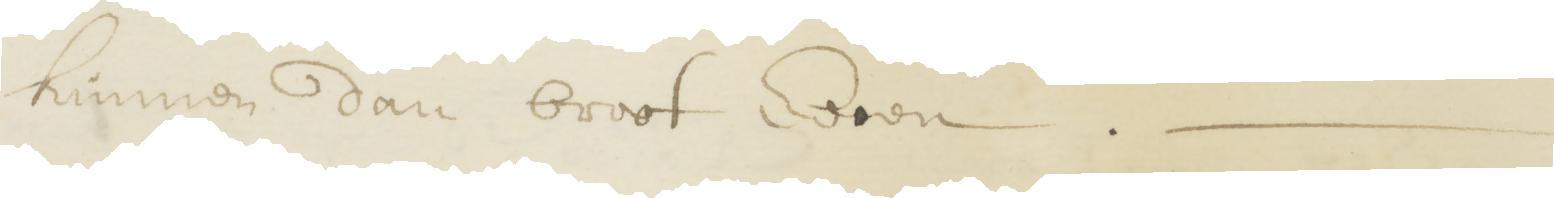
kunnen dan broot Eeten. —
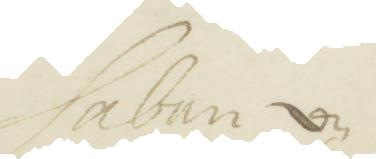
saban en
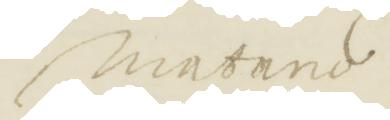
matane
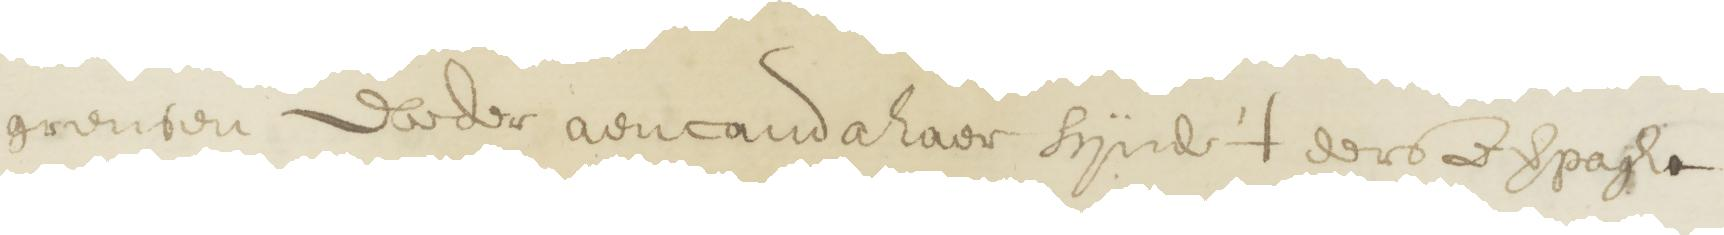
grensen weder aen candahaer sijnde ’t eerste verpaght
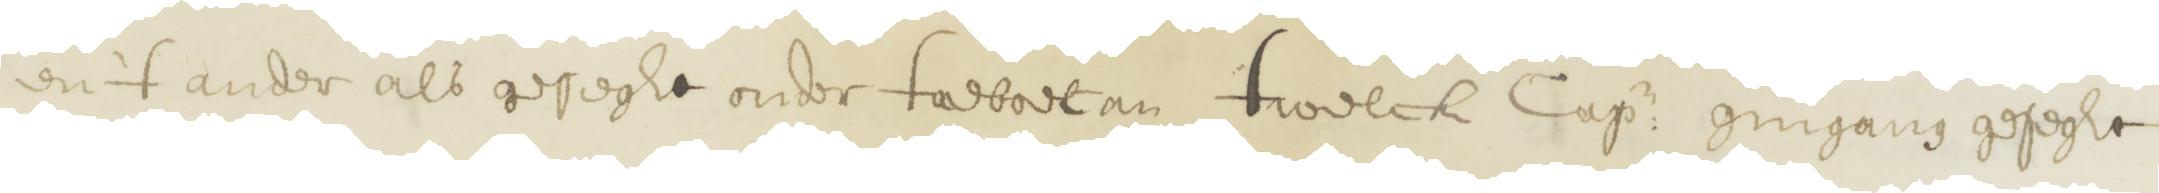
en ’t ander als geseght onder treboecan 'twelck Cap:n gingang geseght
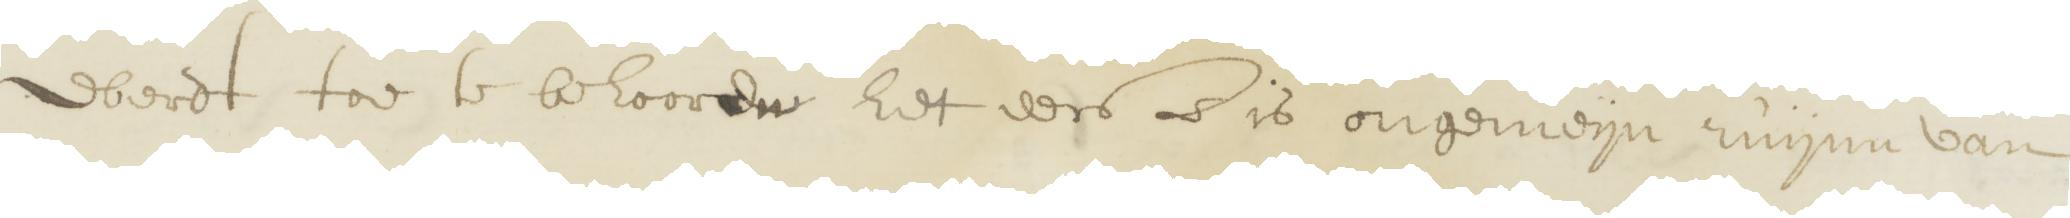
werdt toe te behooren het eerste is ongemeijn ruijm van
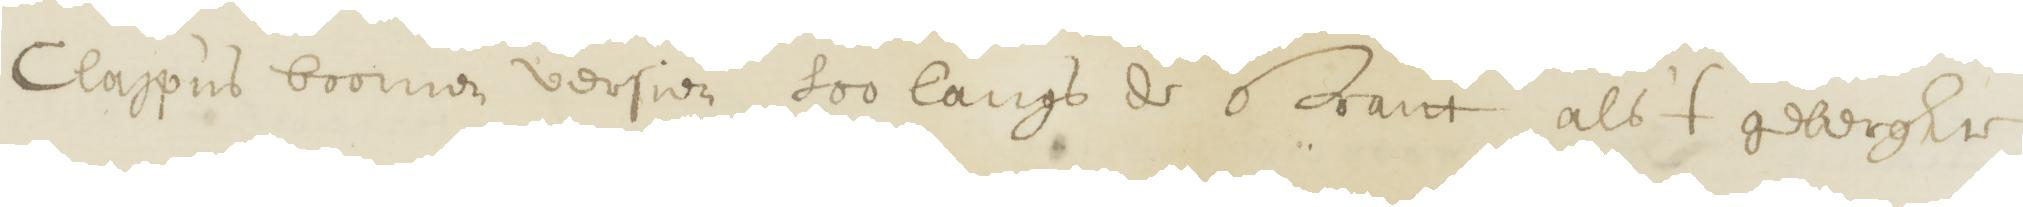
Clappus boomen versien soo langs de strant als ’t geberghte
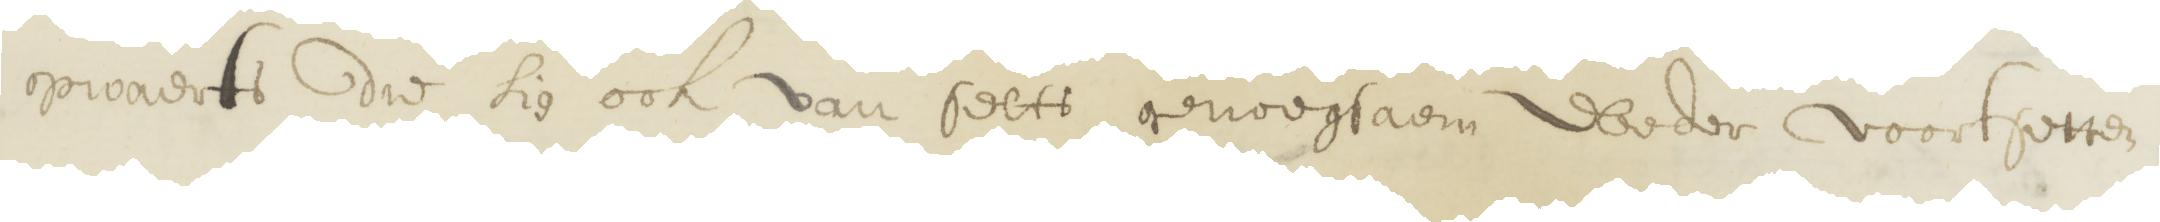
opwaerts die sig ook van selfs genoegsaem weder voortsetten
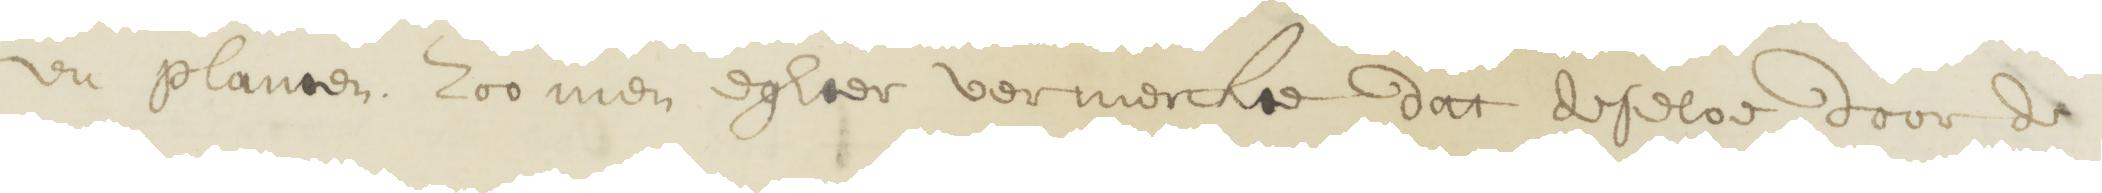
en planten. zoo men eghter vermerckte dat deselve door de
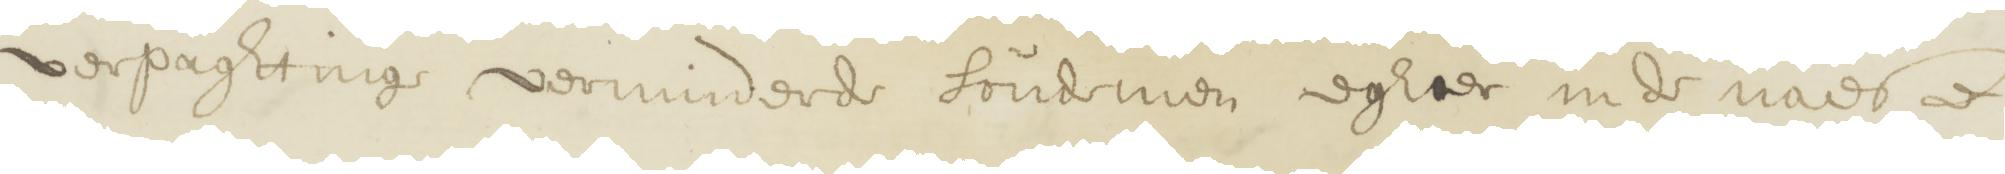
verpaghtinge verminderde soudemen eghter in de naeste
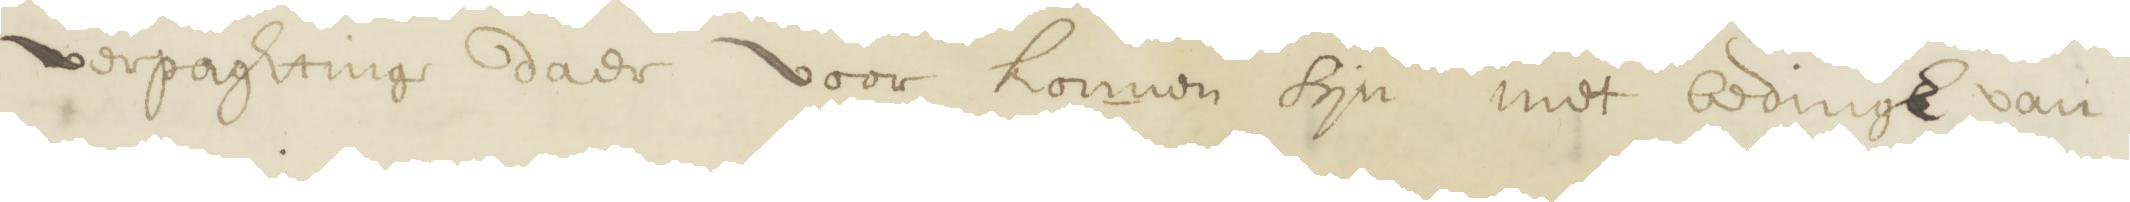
verpaghtinge daer voor konnen sijn met bedingh van
